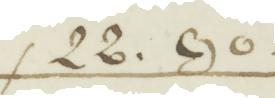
ƒ 22. 90.
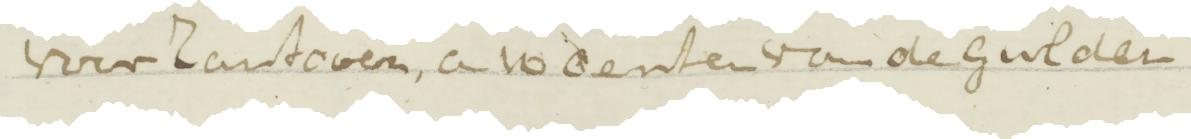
voor Rantcoen a 10 centen van de Gulden
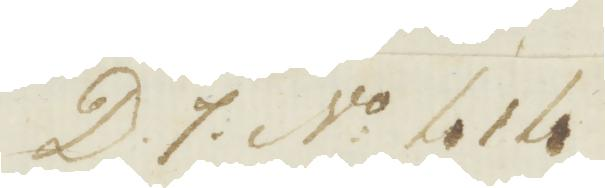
D: 7. N:o 414
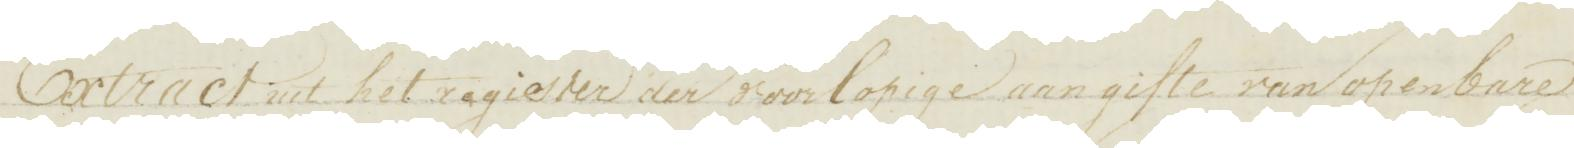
Extract uit het register der voorlopige aangifte van openbare
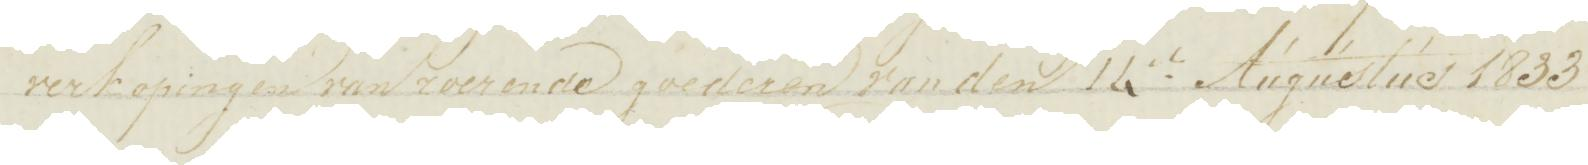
verkopingen van roerende goederen van den 14.e Augustus 1833
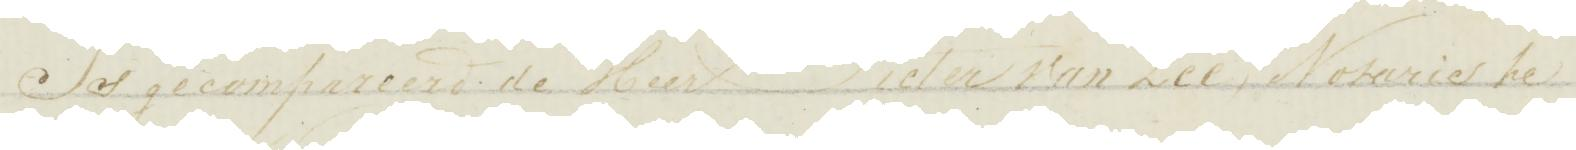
Is gecompareerd de Heer Pieter van Lee, Notaris te
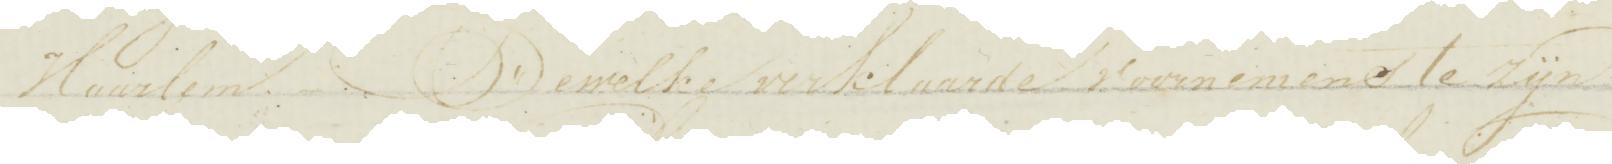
Haarlem. Dewelke verklaarde voornemens te zijn
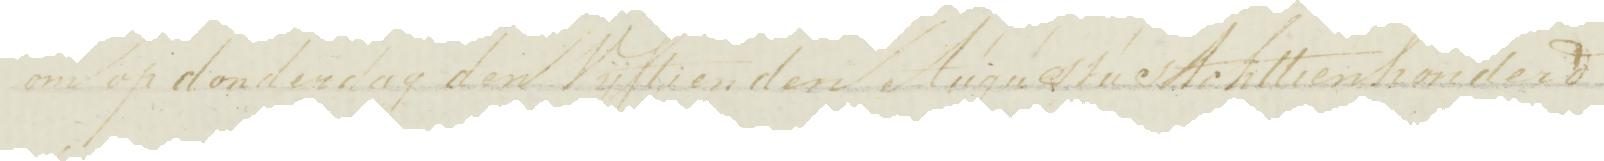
om op donderdag den Vijftienden Augustus Achttienhonderd
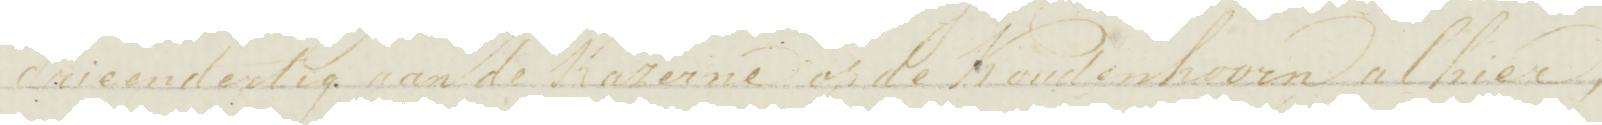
drieendertig aan de Kazerne op de Koudenhoorn alhier,
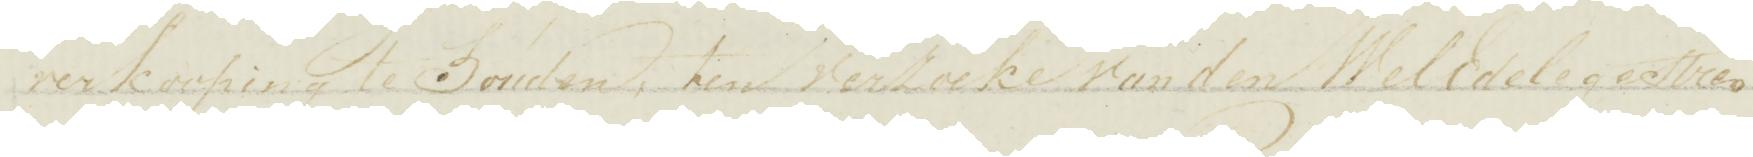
verkooping te houden, ten verzoeke van den Wel Edelgestren
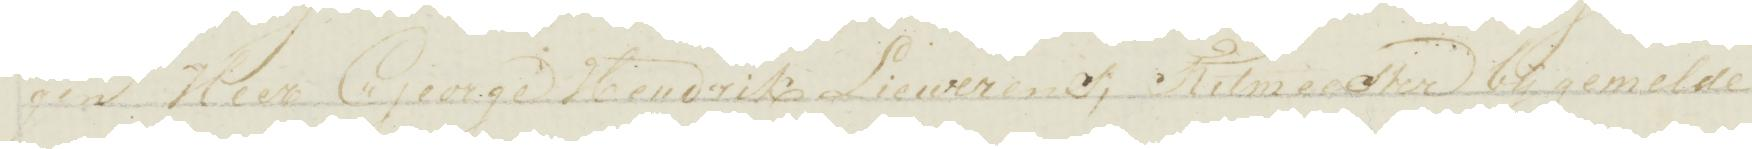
gen Heer George Hendrik Liewerens, Ritmeester bij gemelde
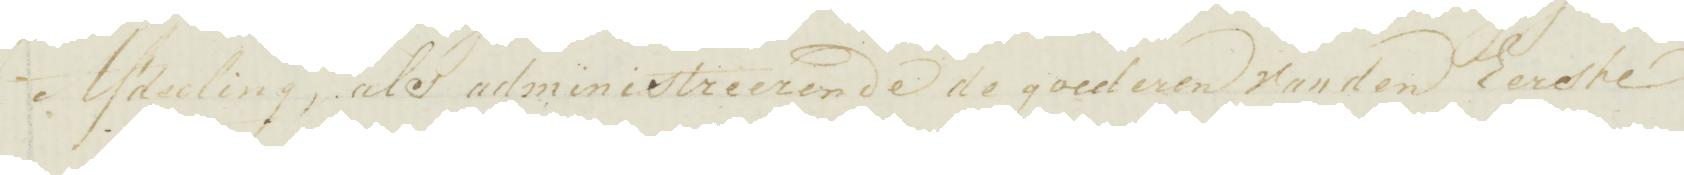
Afdeeling, als administreerende de goederen van den Eerste
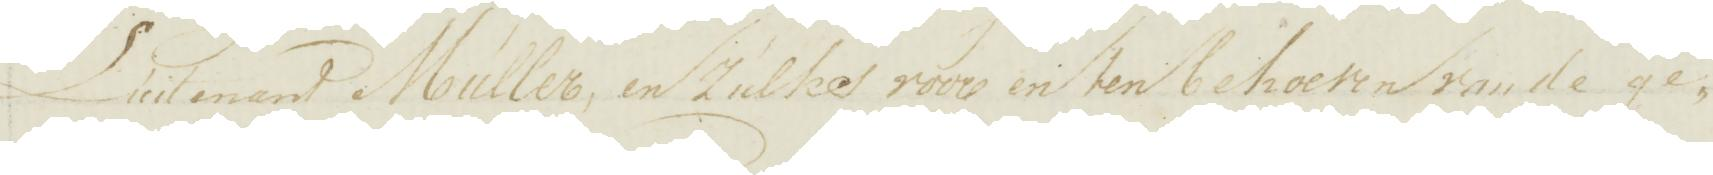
Luitenant Muller, en zulks voor en ten behoeven van de ge„
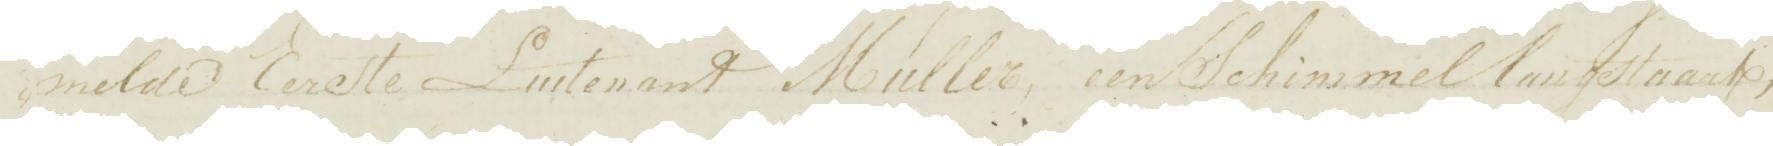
melde Eerste Luitenant Muller een Schimmel langstaart,
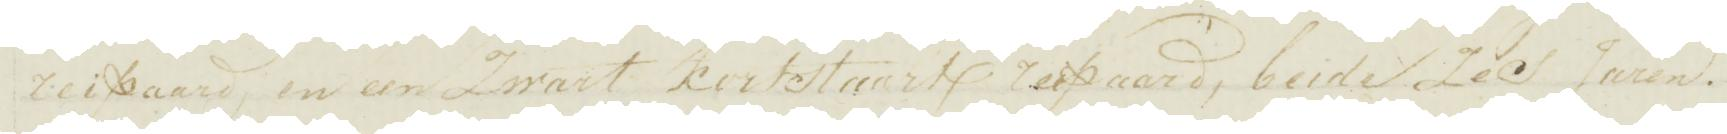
reipaard, en een Zwart kortstaart reipaard, beide Zes Jaren.
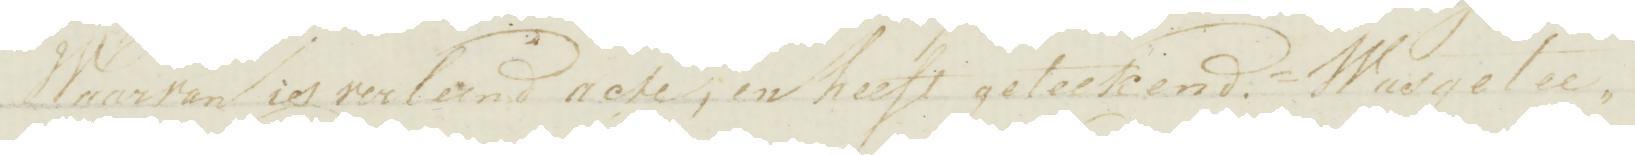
Waarvan is verleend acte, en heeft geteekend =Was getee„
